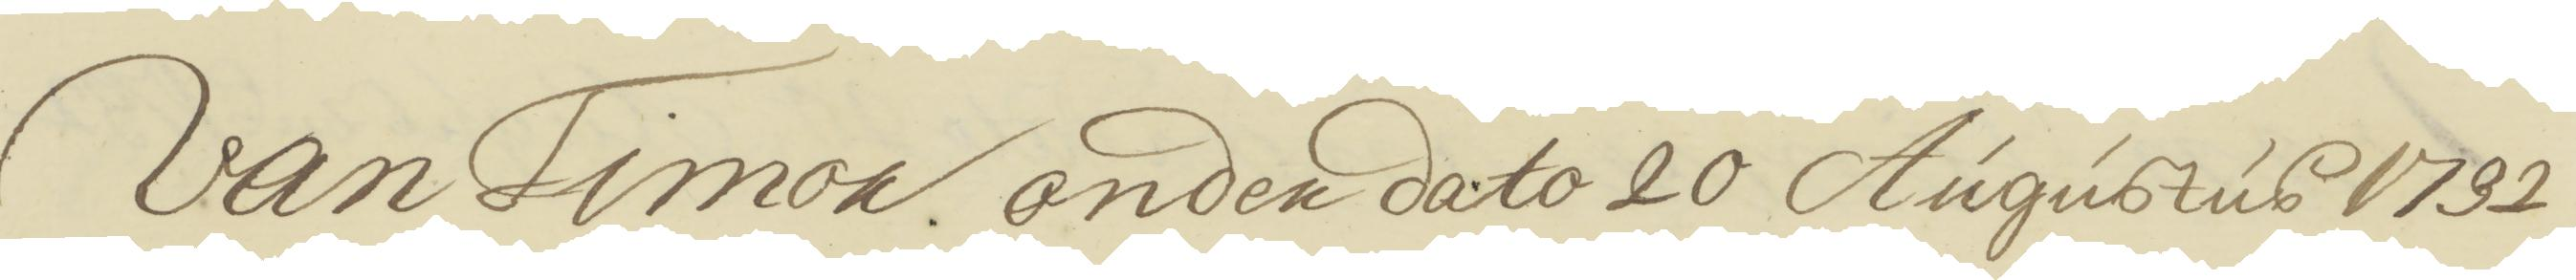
Van Timor. onder dato 20 Augustus 1732
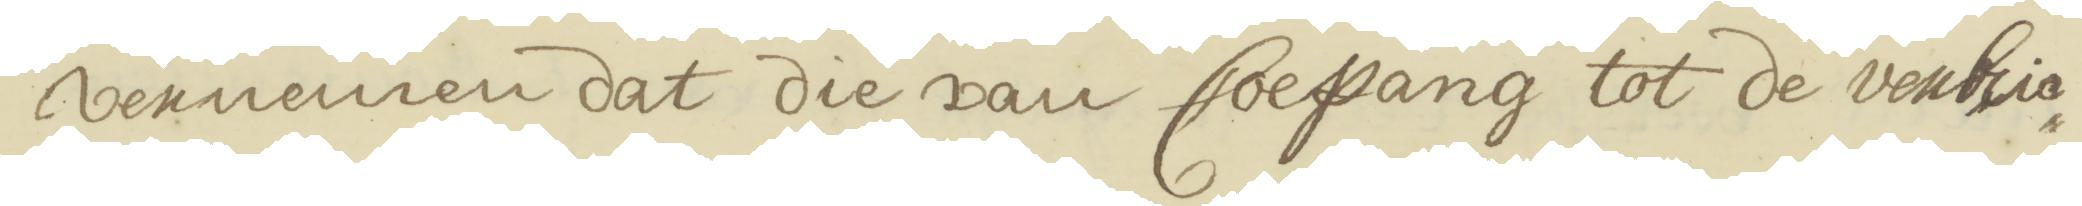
vernemen dat die van Coepang tot de verkie„
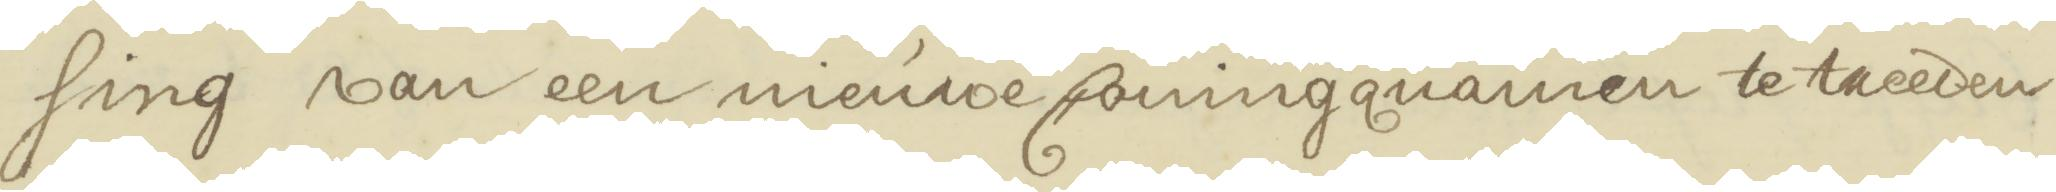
sing van een nieuwe Coning quamen te treeden
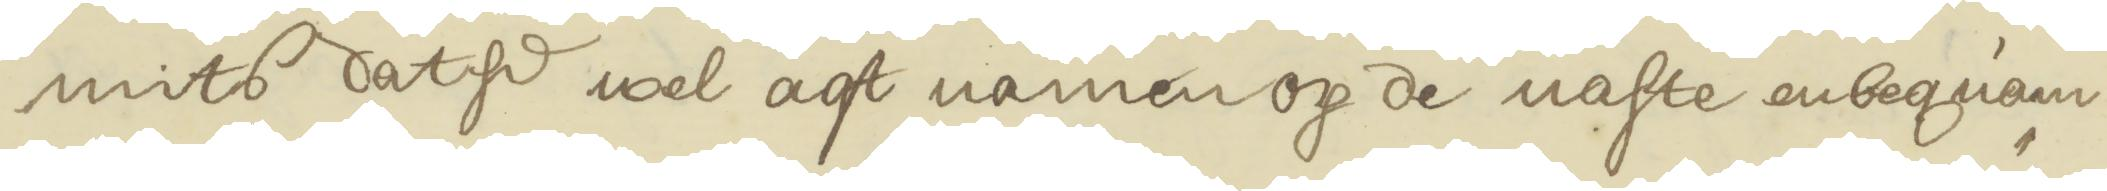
mits dat se wel agt namen op de naste en bequam„
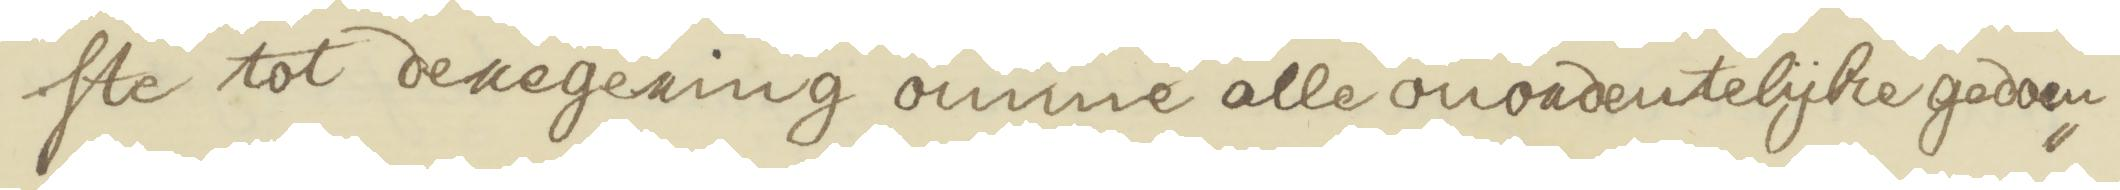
ste tot de regering omme alle onordentelijke gedoen„
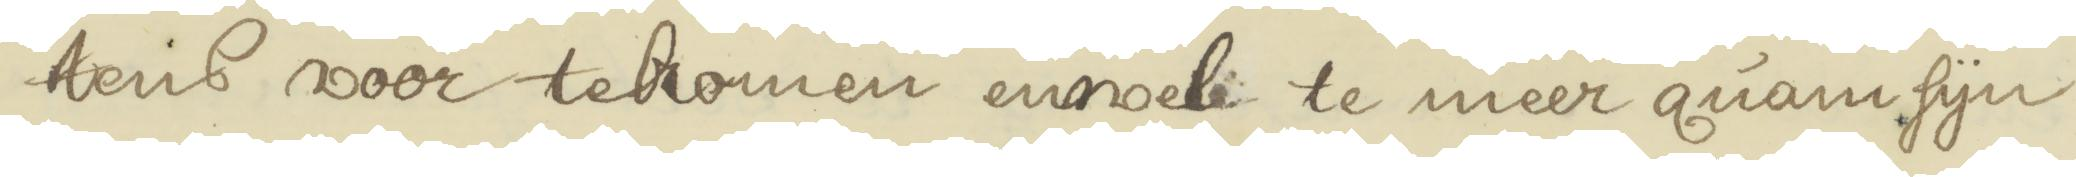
tens voor tekomen en welt te meer quam sijn
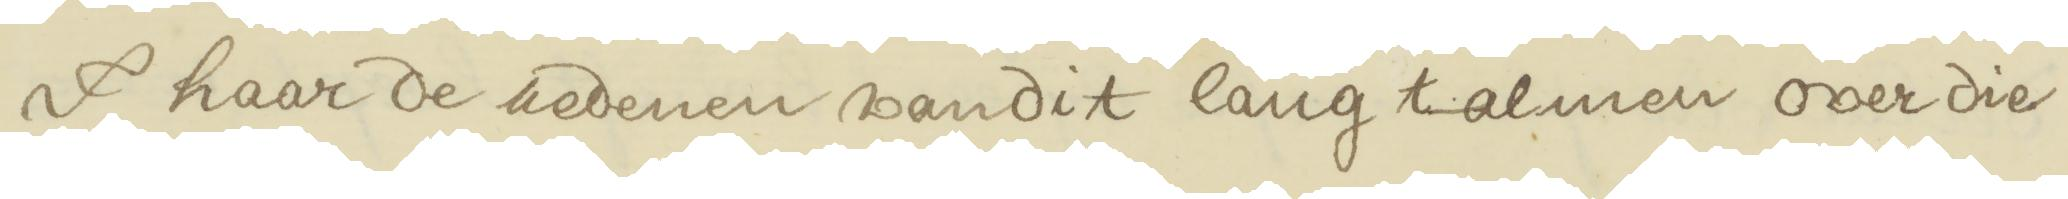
E haar de redenen van dit lang talmen over die
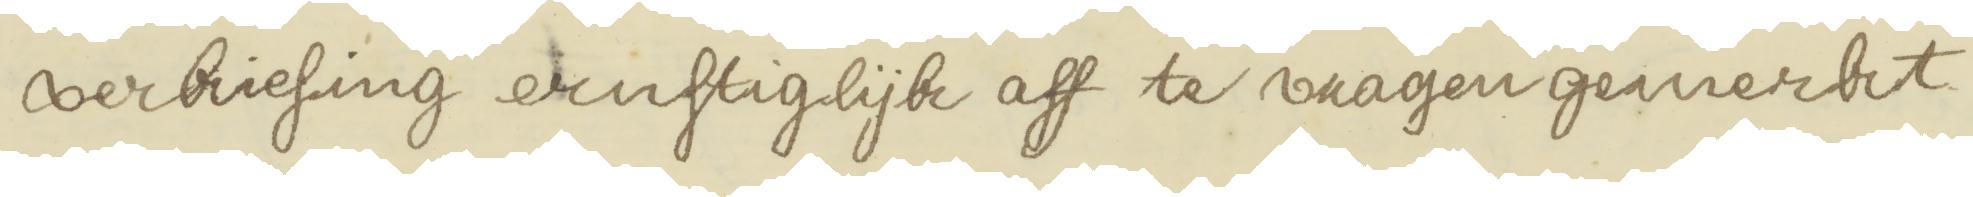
verkiesing ernstiglijk aff te vragen gemerkt
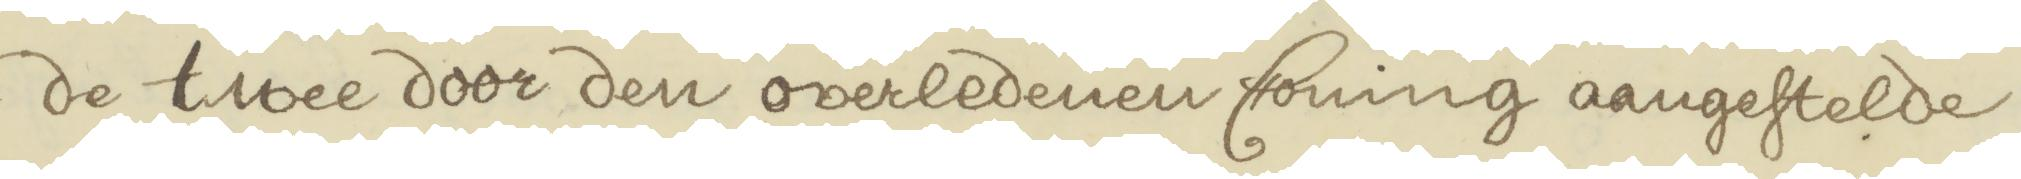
de twee door den overledenen Coning aangestelde
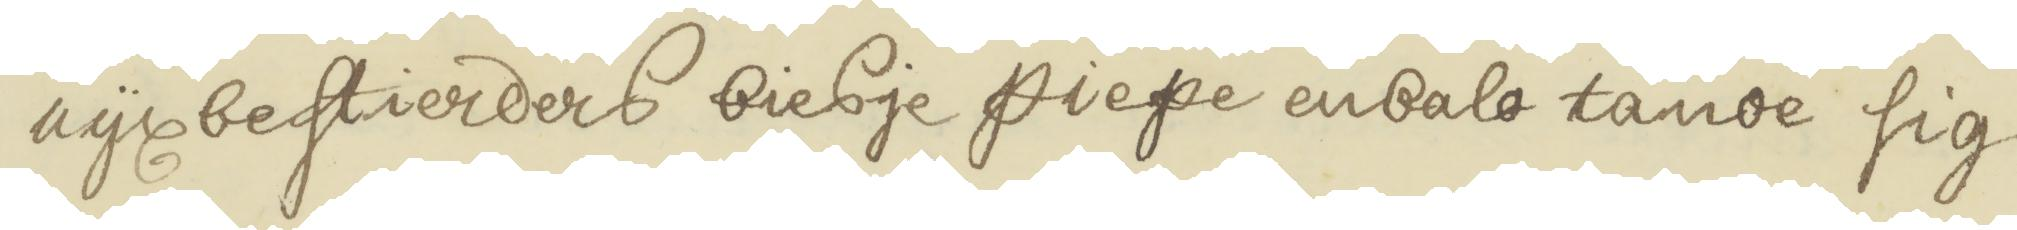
rijxbestierders biesje piepe en balo tanoe sig
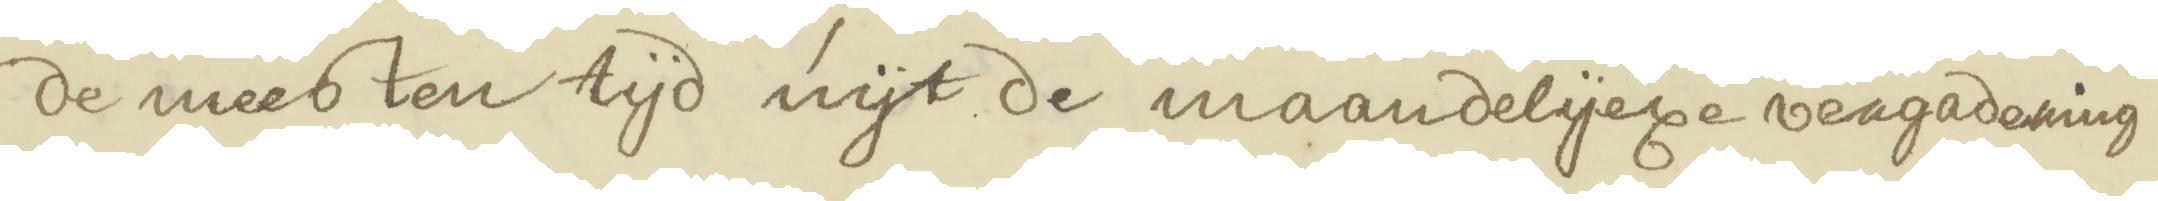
de meesten tijd uijt de maandelijexe vergadering
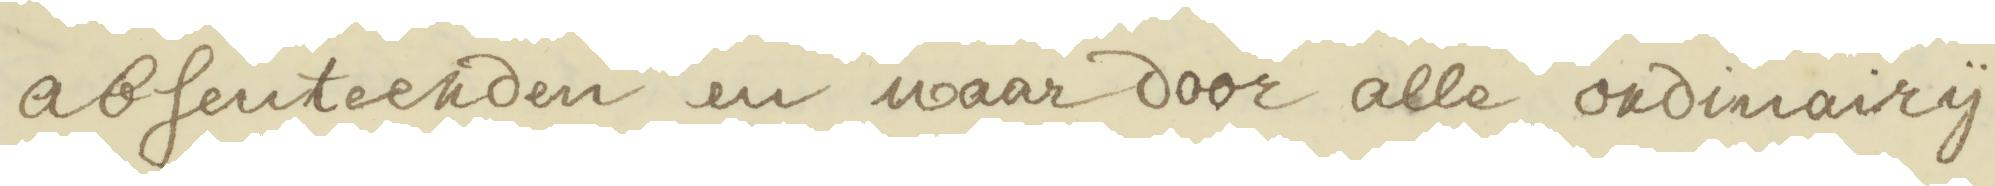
absenteerden en waar door alle ordinairij
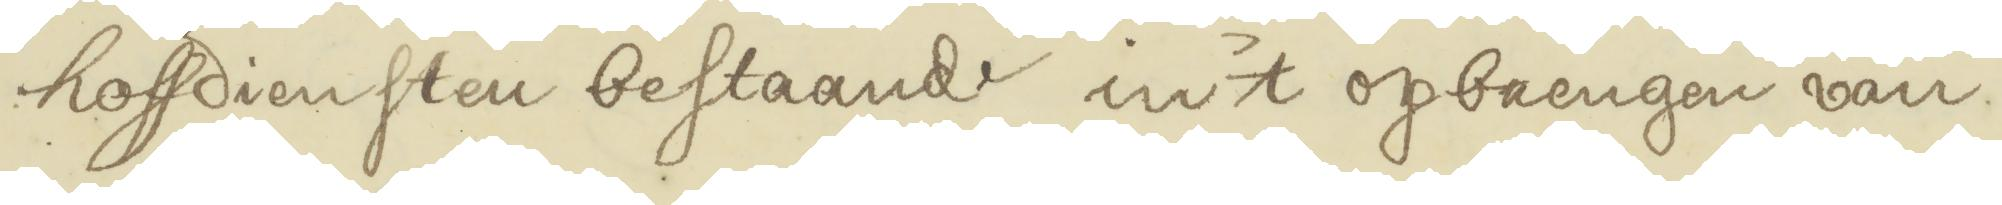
hoffdiensten bestaande in ’t opbrengen van
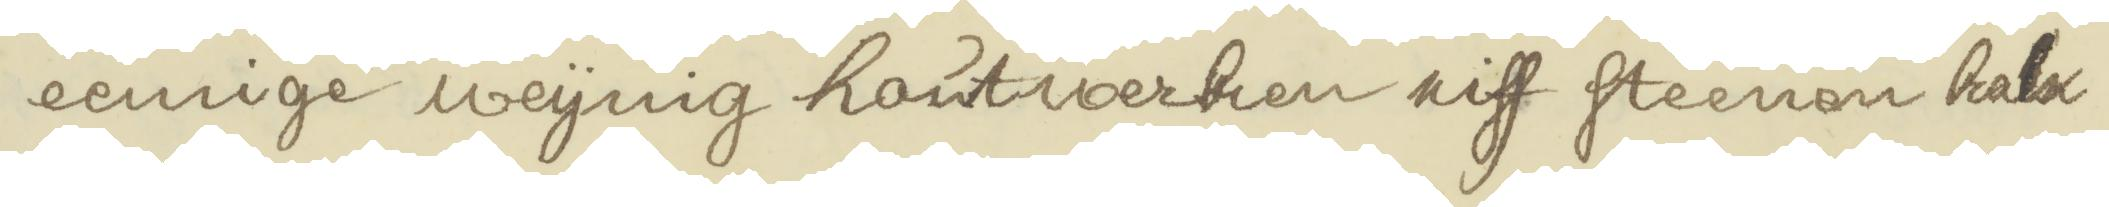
eenige weijnig houtwerken riff steenen kalk
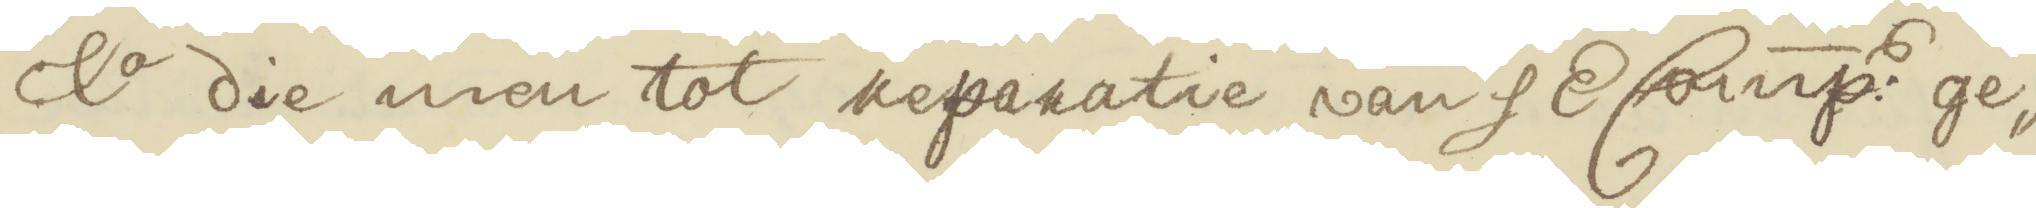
&a die men tot reparatie van s E Comp:s ge
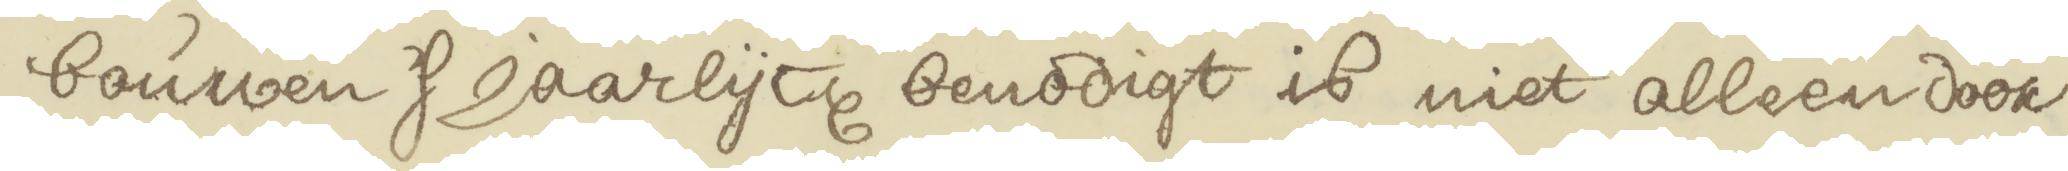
bouwen 's jaarlijcx benodigt is niet alleen door
